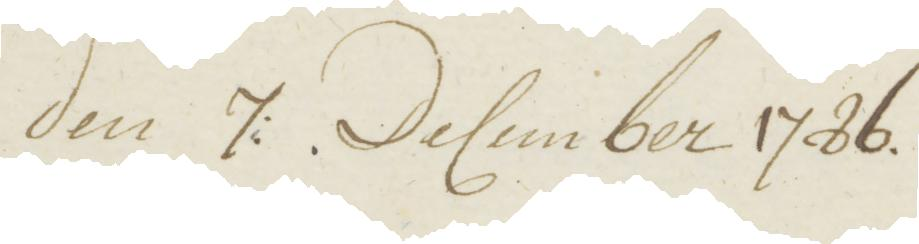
den 7: December 1786.
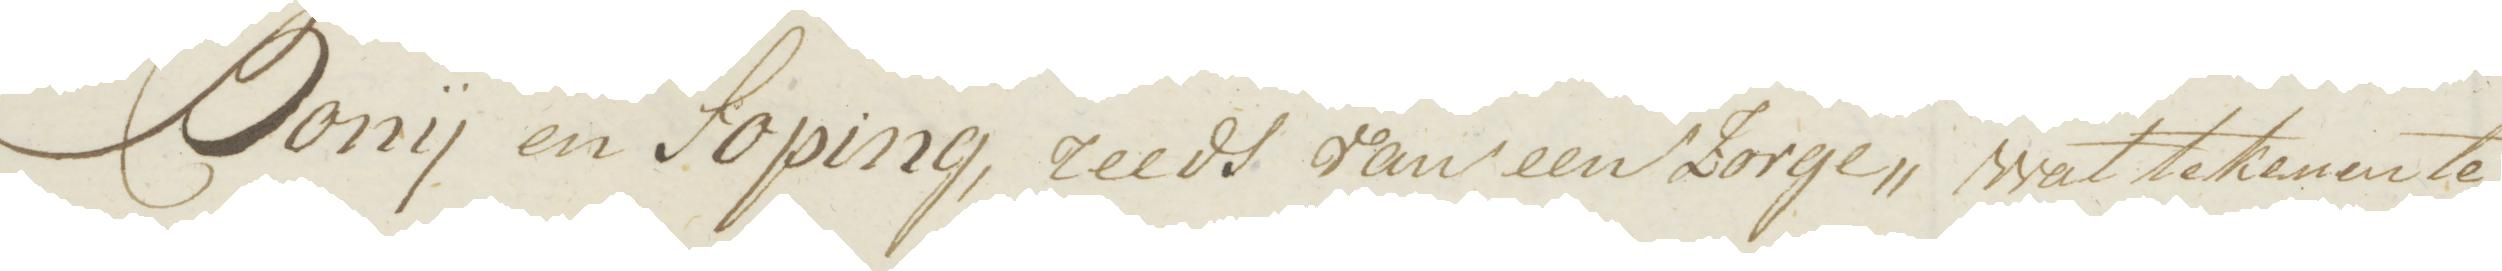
Bonij en Soping, reeds van een zorge„ wat tekenen te
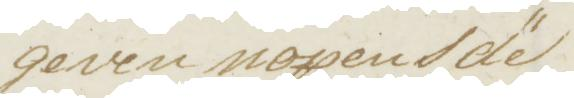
geven nopens de
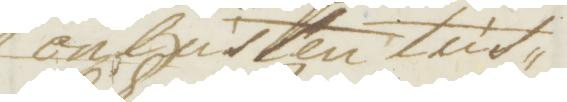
onlusten tus„
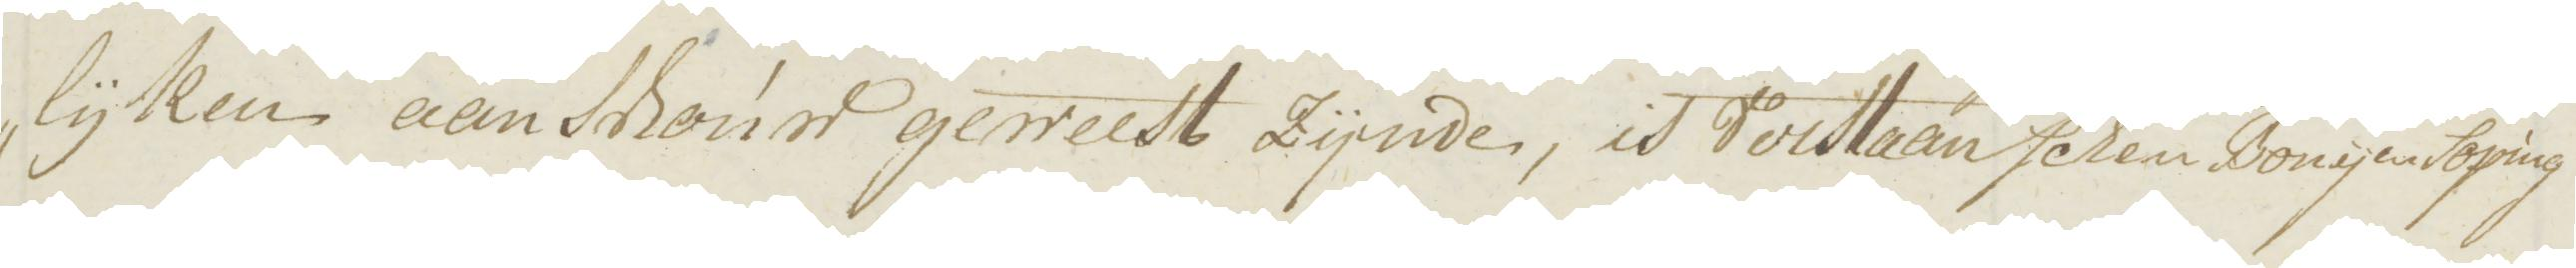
„lijken aanschouw geweest zijnde, is verstaan schen Bonij en Soping
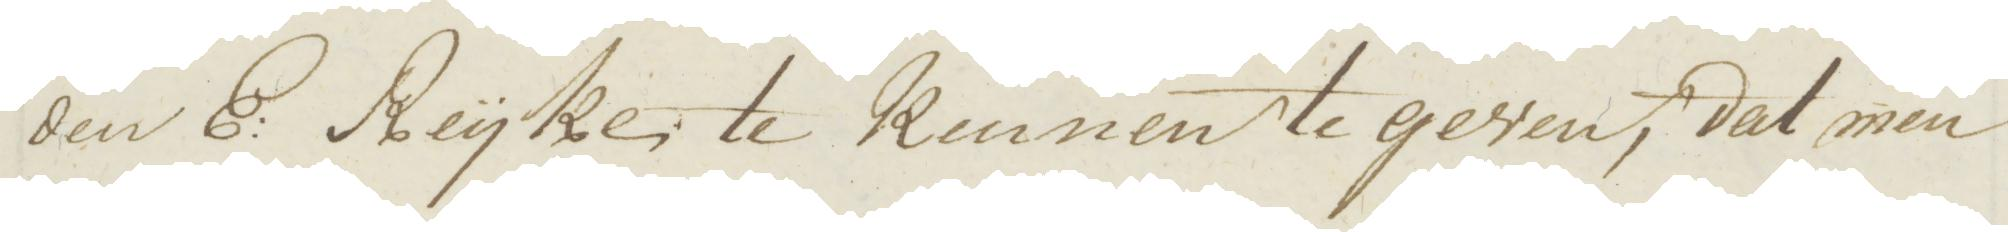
den E: Reijke te kennen te geven, dat men
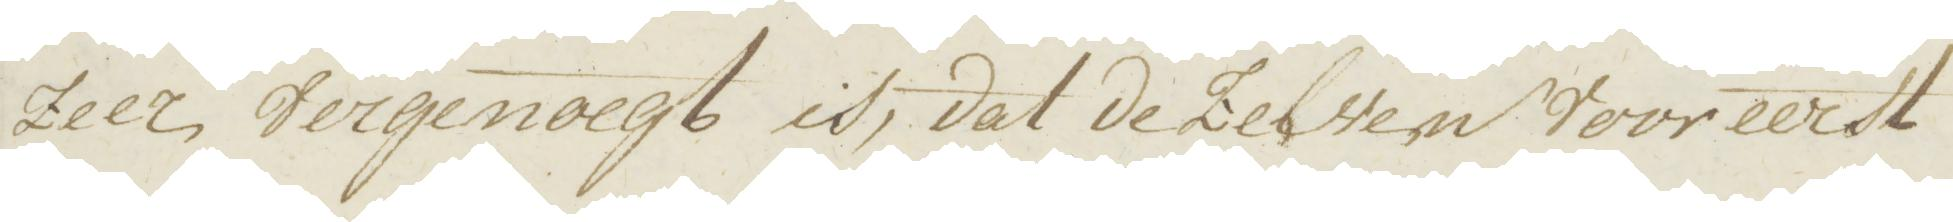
zeer vergenoegt is, dat de zelven voor eerst
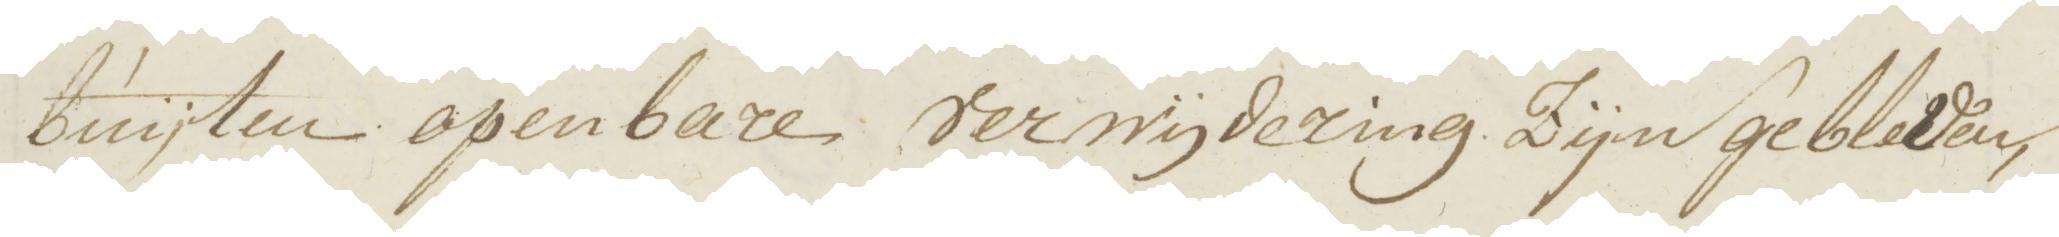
buijten openbare verwijdering zijn gebleven,
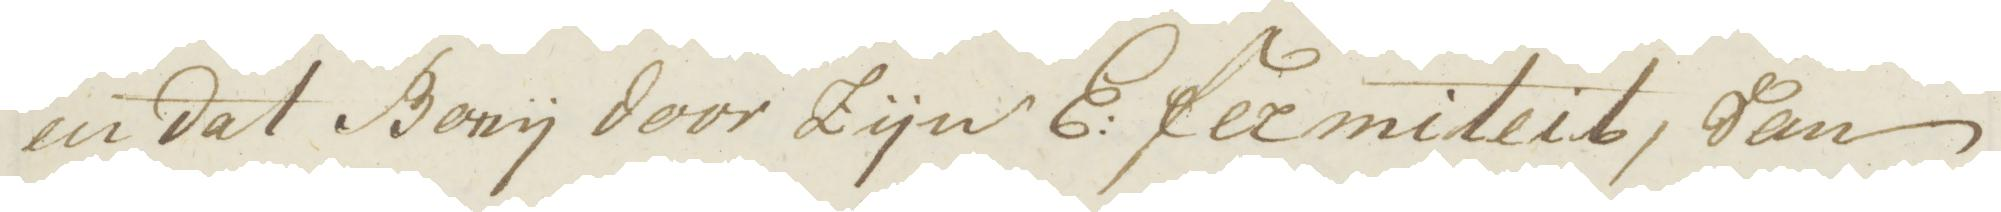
en dat Bonij door zijn E: fermiteit, van
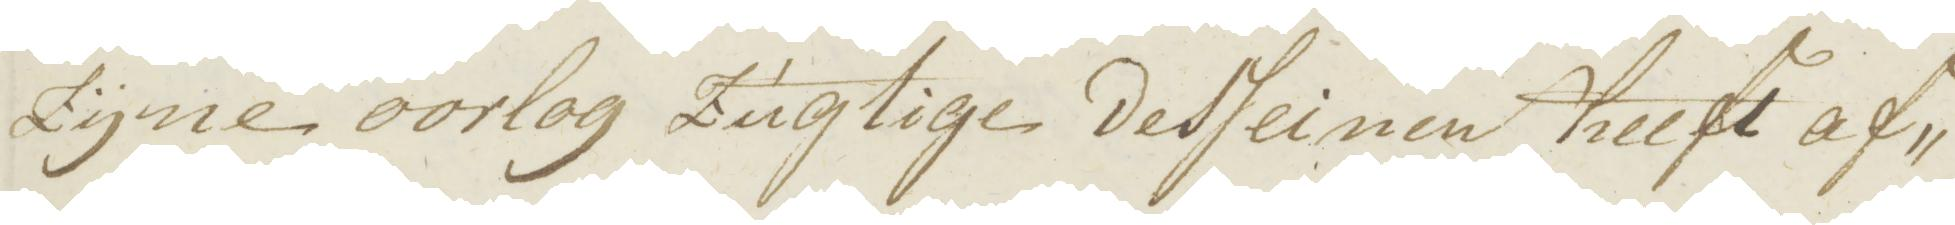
zijne oorlog zugtige desseinen heeft af„
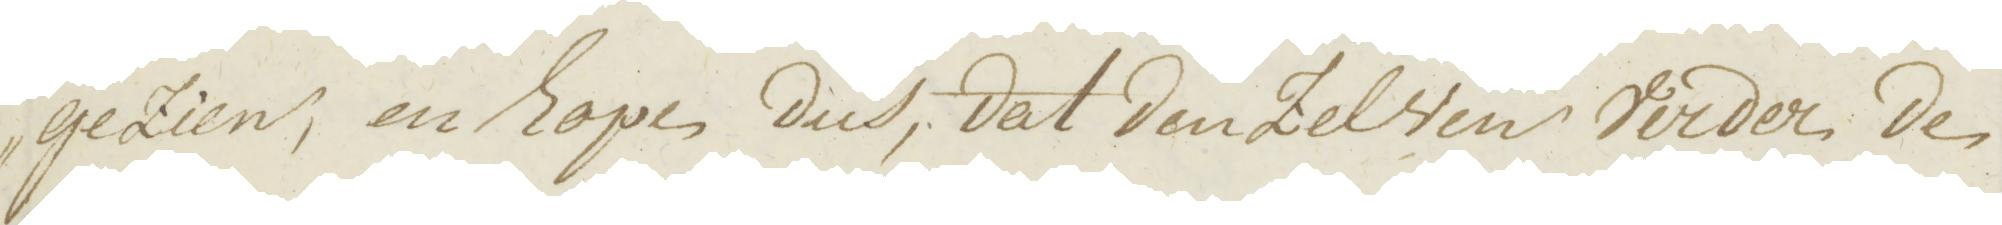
„gezien, en hope dus, dat denzelven verder de
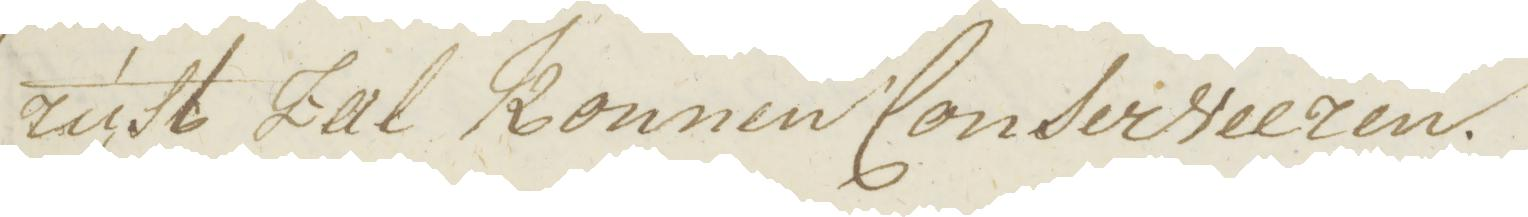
rust zal konnen conserveeren.
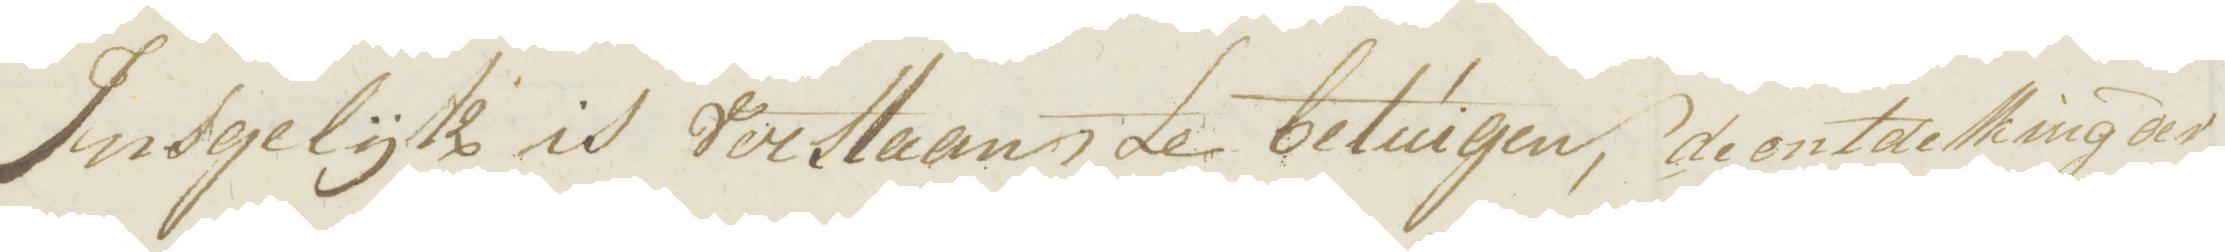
Insgelijk is verstaan te betuigen, de ontdeking des
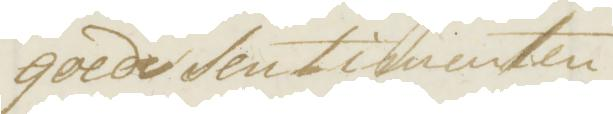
goede sentimenten
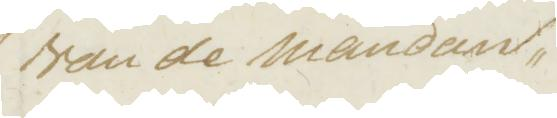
van de mandan„
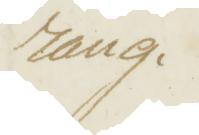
rang.
